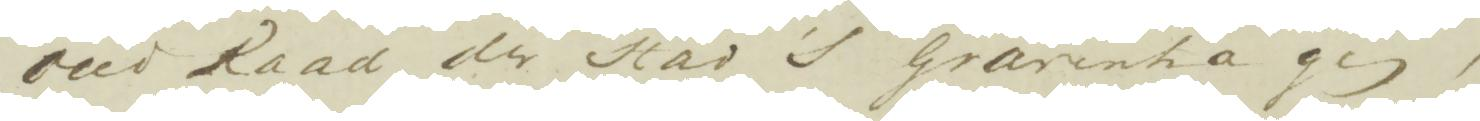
oud Raad der stad 's Gravenhage,
